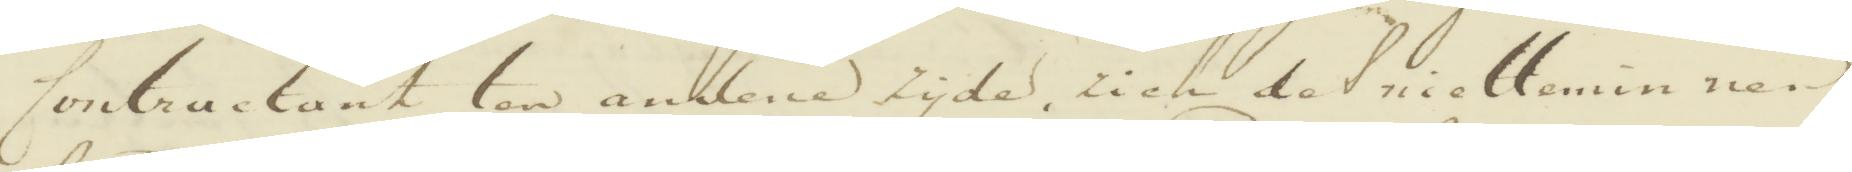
Contractant ten andere zijde, zich des niettemin ver
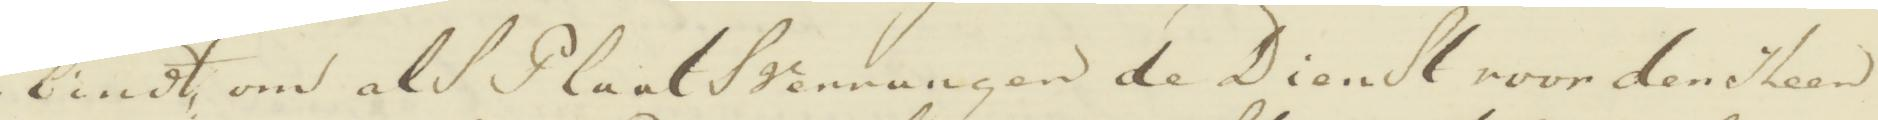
bindt, om als Plaatsvervanger de Dienst voor den Heer
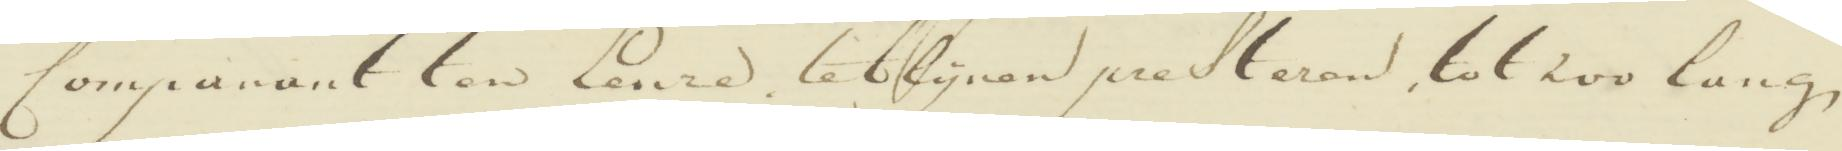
Comparant ten Eenre, te blijven presteren, tot zoo lang,
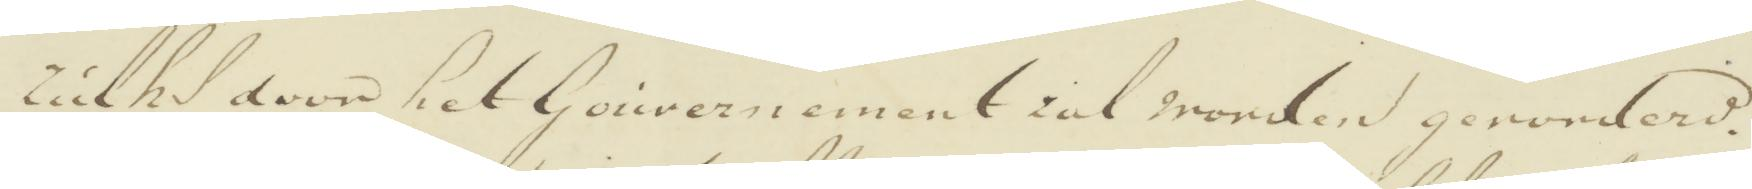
zulks door het Gouvernement zal worden gevorderd.
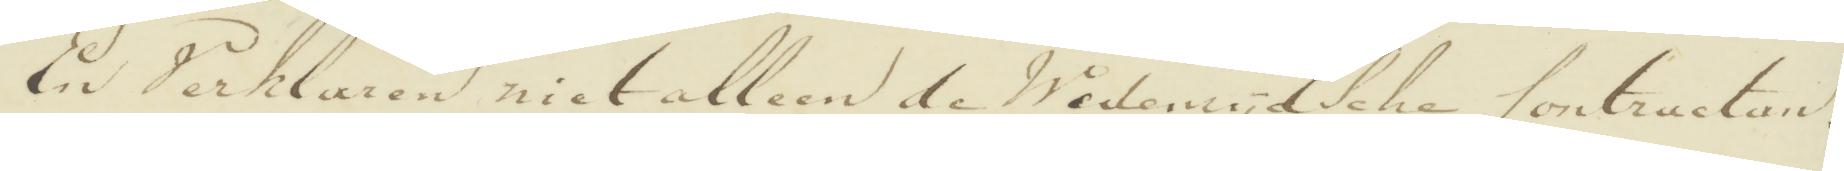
En Verklaren niet alleen de Wederzijdsche Contractan,
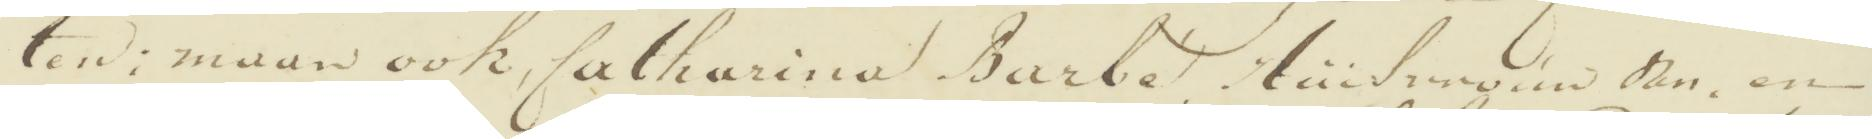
ten; maar ook, Catharina Barbé, Huisvrouw van, en
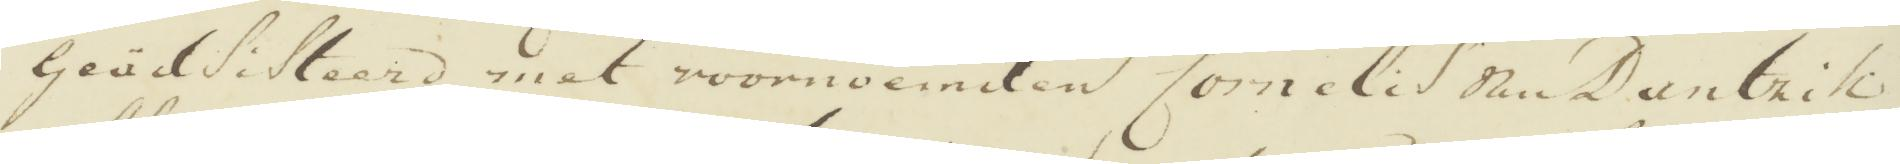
geädsisteerd met voornoemden Cornelis van Dantzik
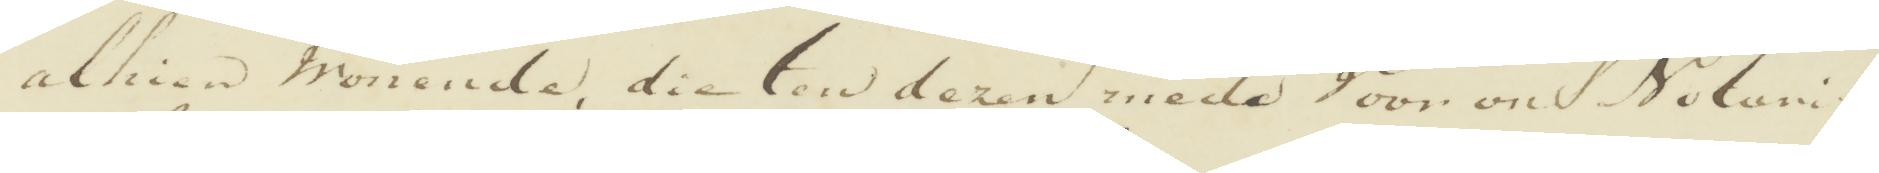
alhier wonende, die ten dezen mede voor ons Notaris
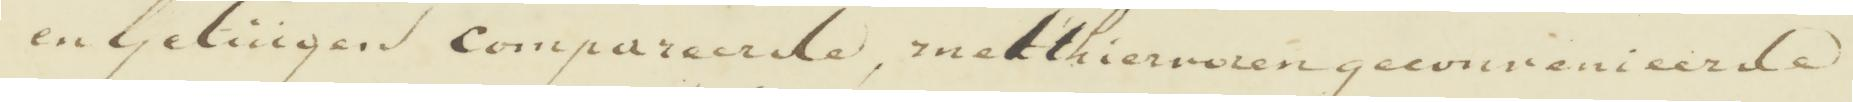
en Getuigen compareerde, met 't hiervoren geconvenieerde
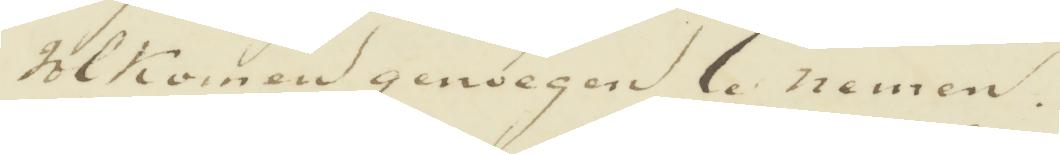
volkomen genoegen te nemen.
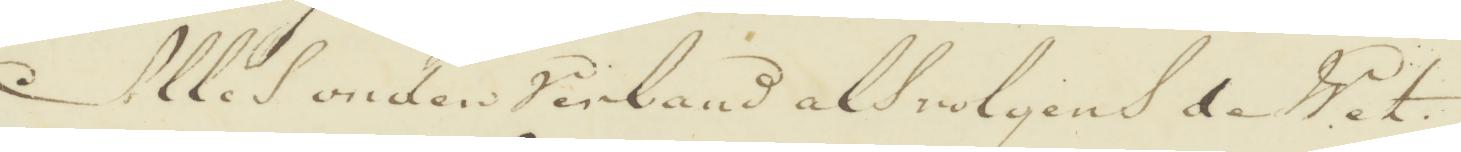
Alles onder Verband als volgens de Wet.
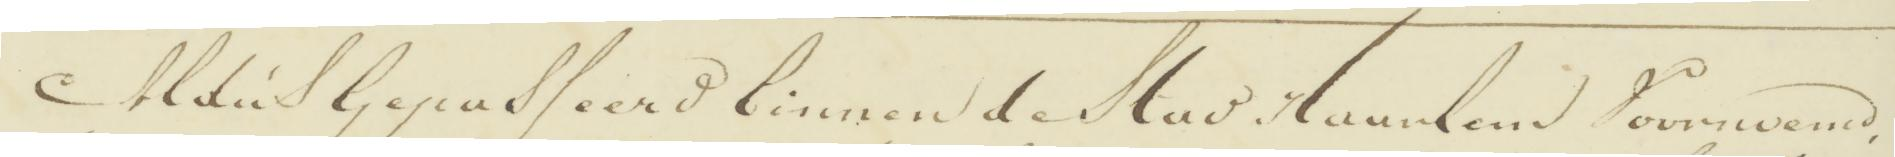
Alis Gepasseerd binnen de stad Haarlem voornoemd,
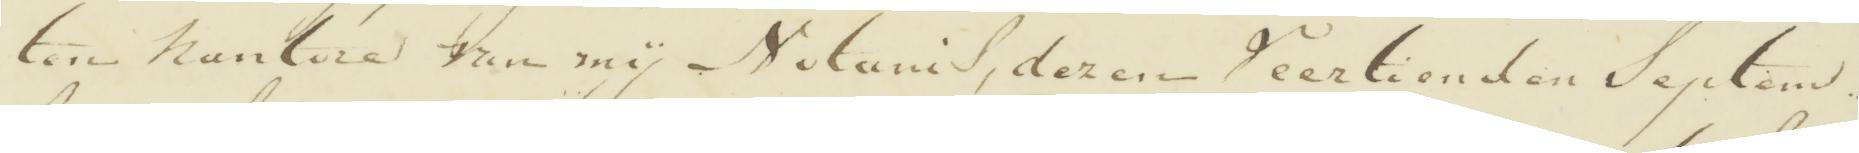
ten kantore van mij Notaris, dezen Veertienden Septem
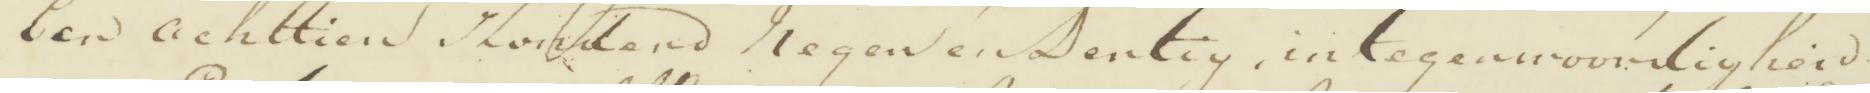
ber achttien Honderd Negen en Dertig, in tegenwoordigheid
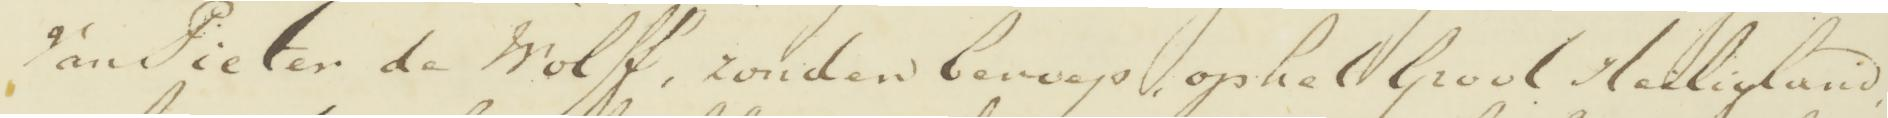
van Pieter de Wolff, zonder beroep, op het Groot Heiligland,
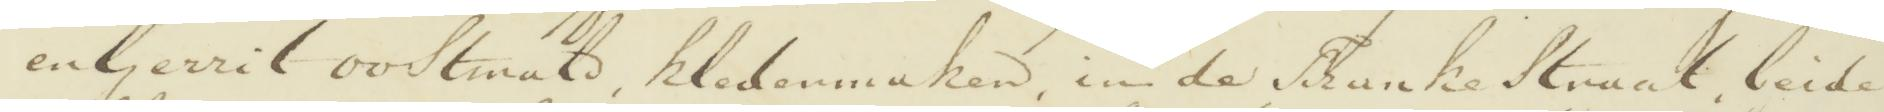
en Gerrit oostwald, kledermaker, in de Frankestraat, beide
